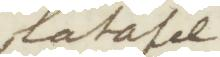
latafel
